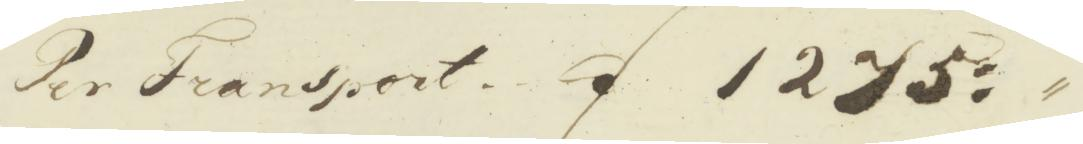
Per Transport ƒ 1275: „
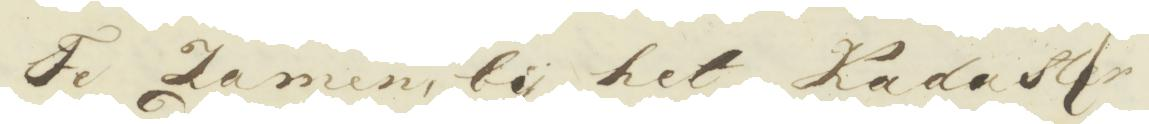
Te zamen, bij het Kadaster
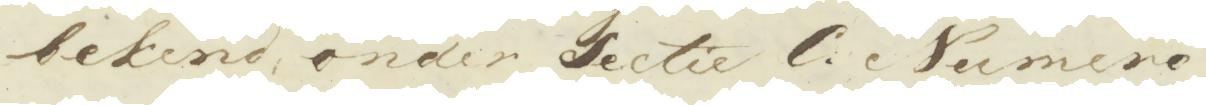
bekend, onder Sectie C: Numero
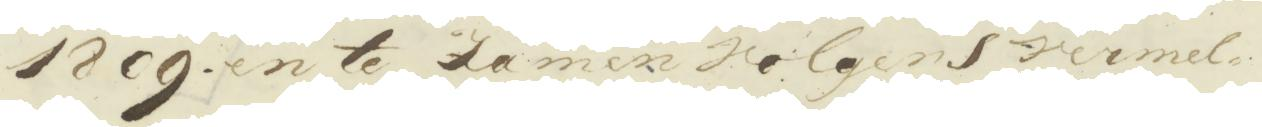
1809. en te zamen volgens vermel„
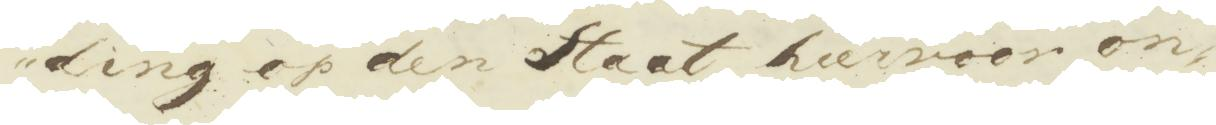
„ding op den Staat hiervoor on„
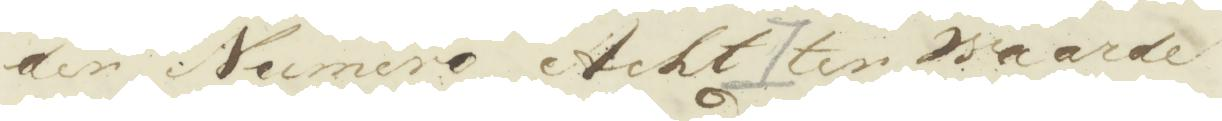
der Numero Acht] ter Waarde
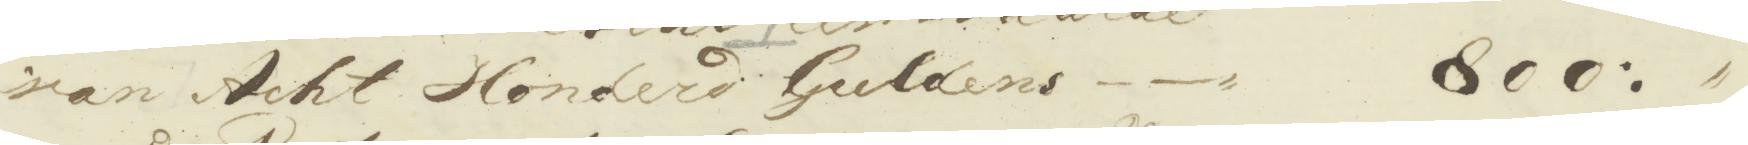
van Acht Honderd Guldens ——„ 800: „
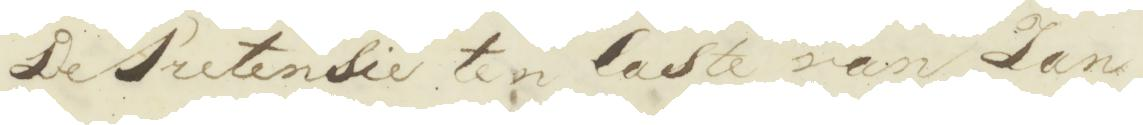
De Pretensie ten laste van Ian
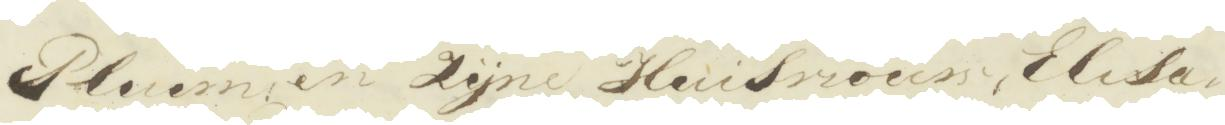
Pluim, en zijne Huisvrouw, Elisa„
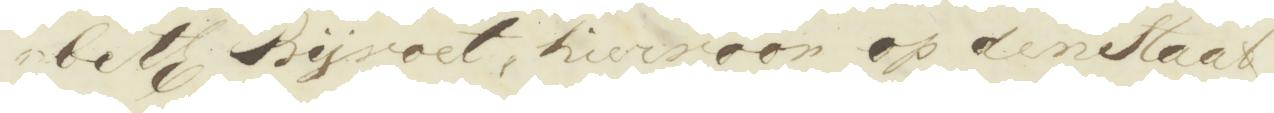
beth Bijvoet, hiervoor op den Staat
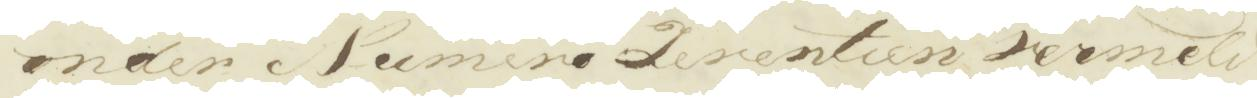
onder Numero Zeventien vermeld
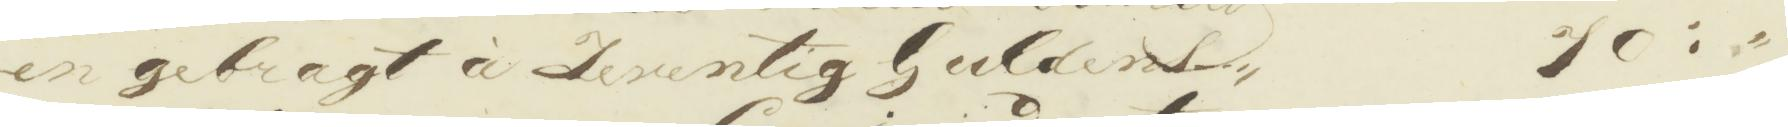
en gebragt à Zeventig Guldens„ 70: =
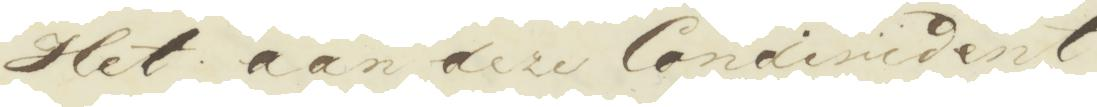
Het aan deze Condivident
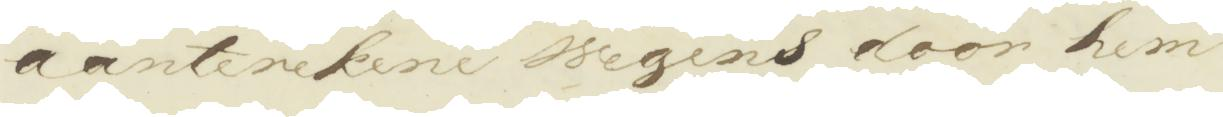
aanterekene wegens door hem
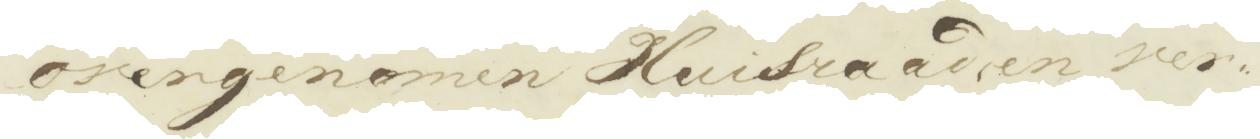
overgenomen Huisraad, en ver„
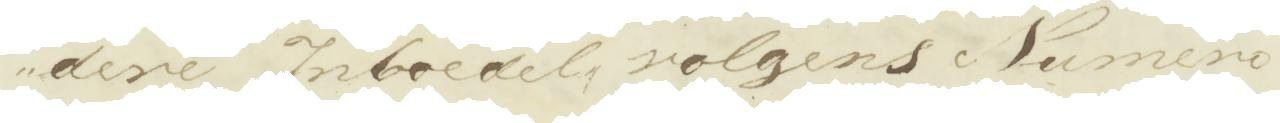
„dere Jnboedel, volgens Numero
